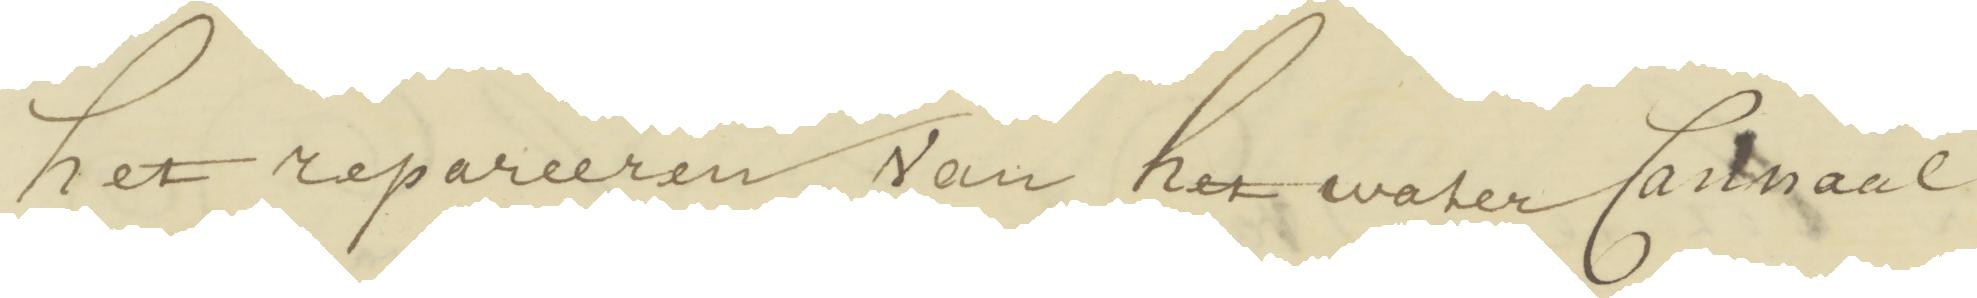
het repareeren van het water Cannaal
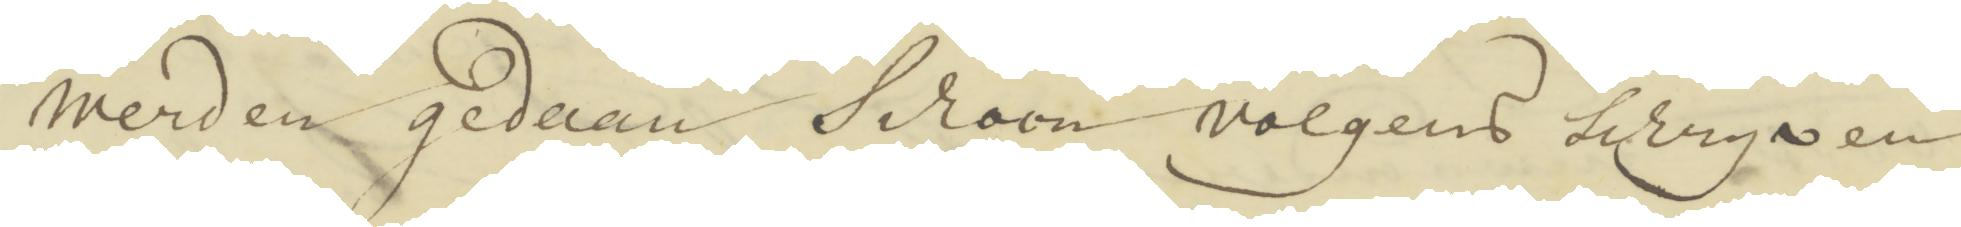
werden gedaan schoon volgens schryven
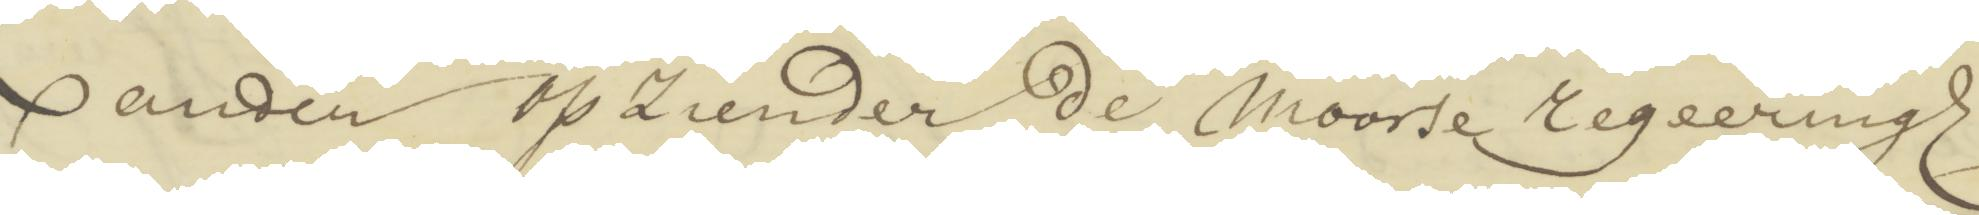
vanden op ziender de moorse regeeringh
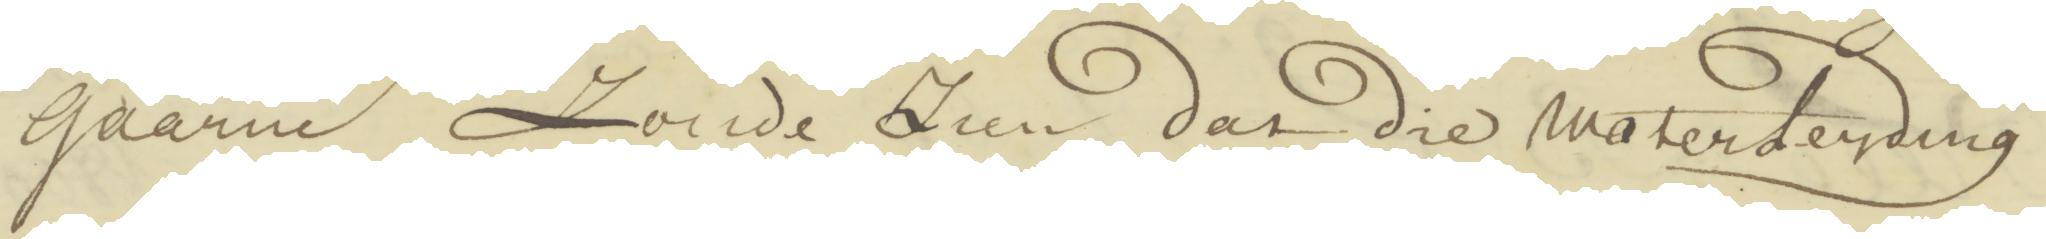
gaarne zoude zien dat die waterleyding
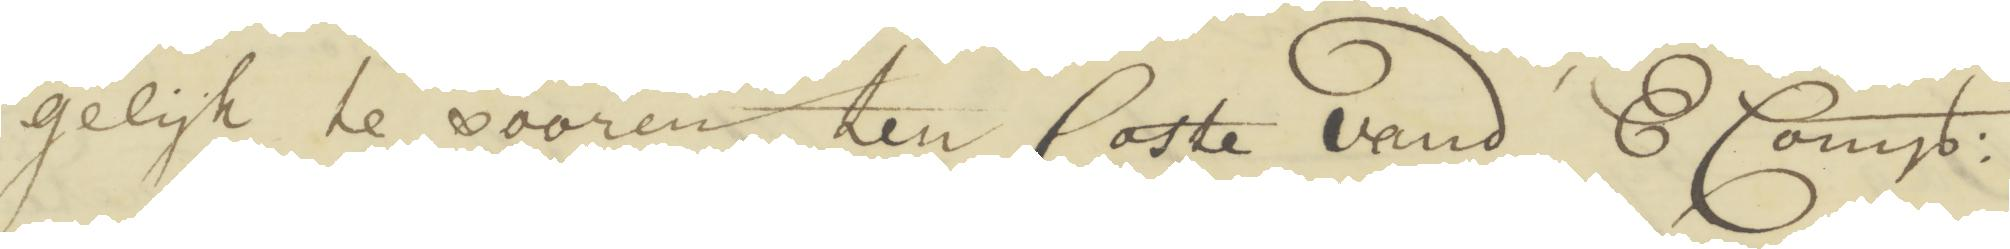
gelijk te vooren ten Coste vand' E Comp:
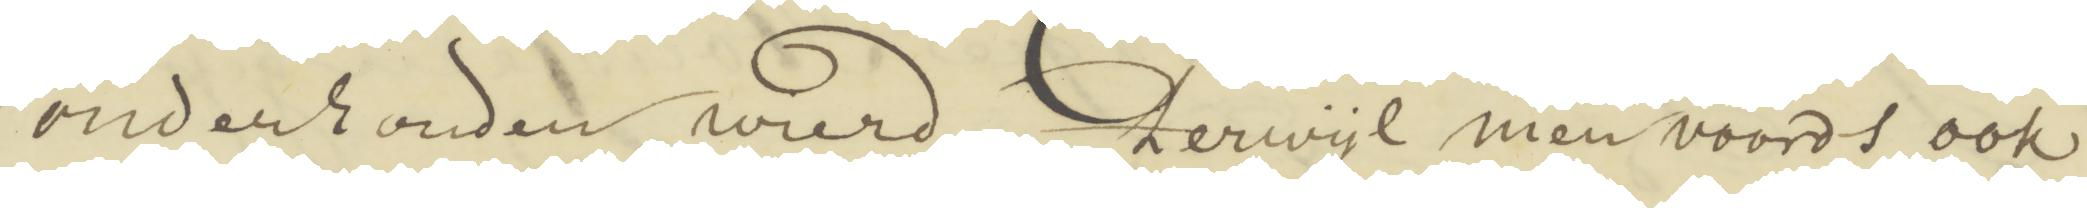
onderhouden wierd terwijl men voords ook
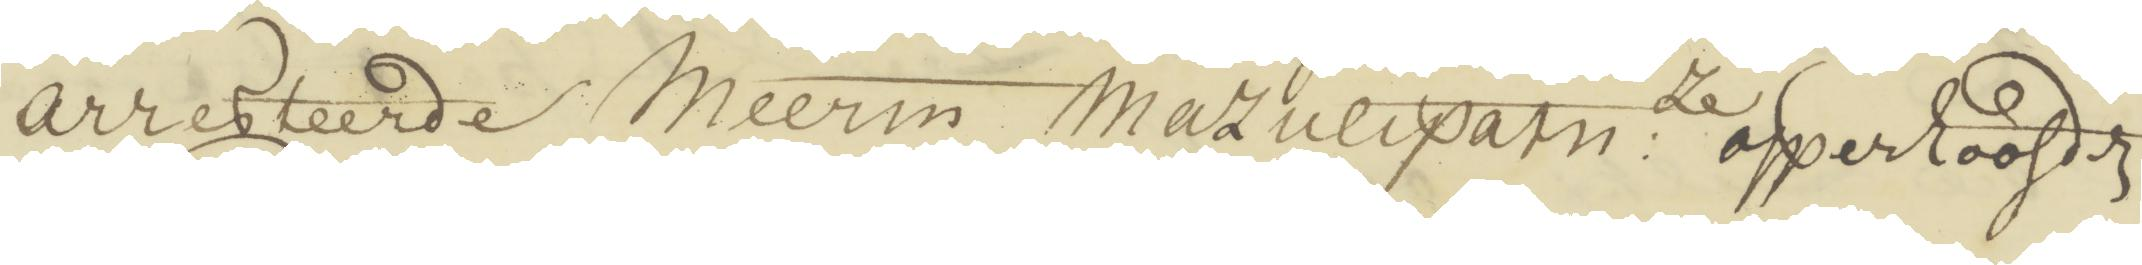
arresteerde meerm mazulipatn:ze opperhoofden
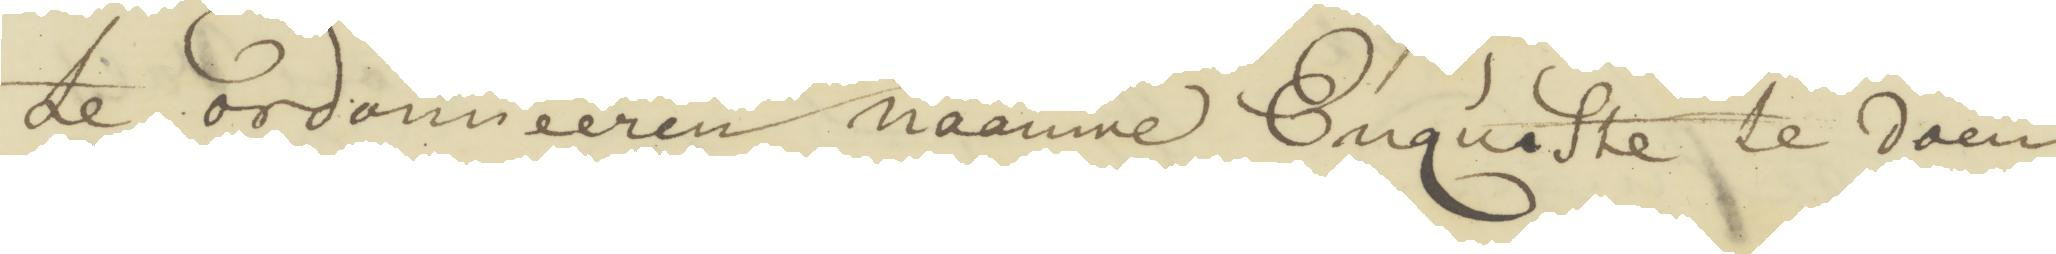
te ordonneeren naauwe Enquiste te doen
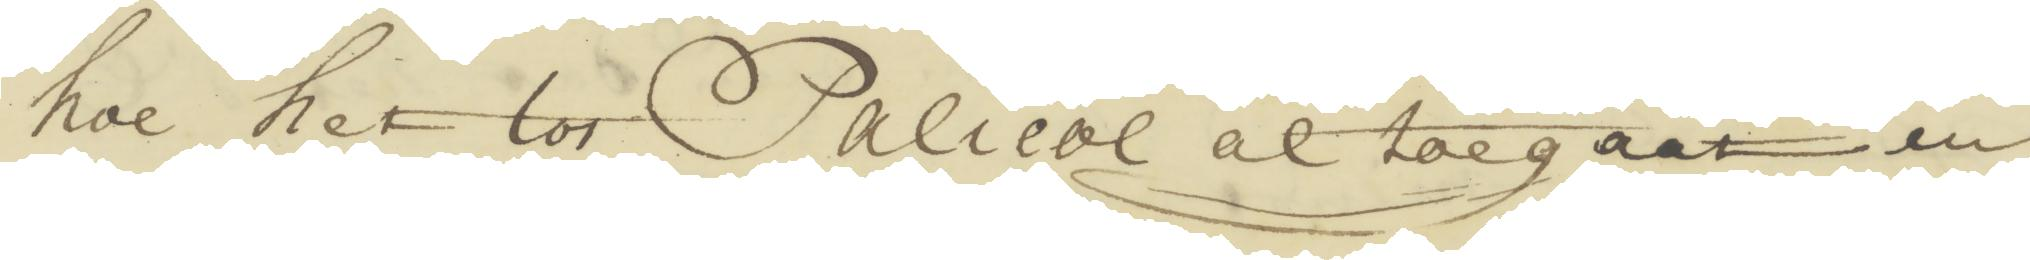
hoe het tot Palicol al toe gaat en
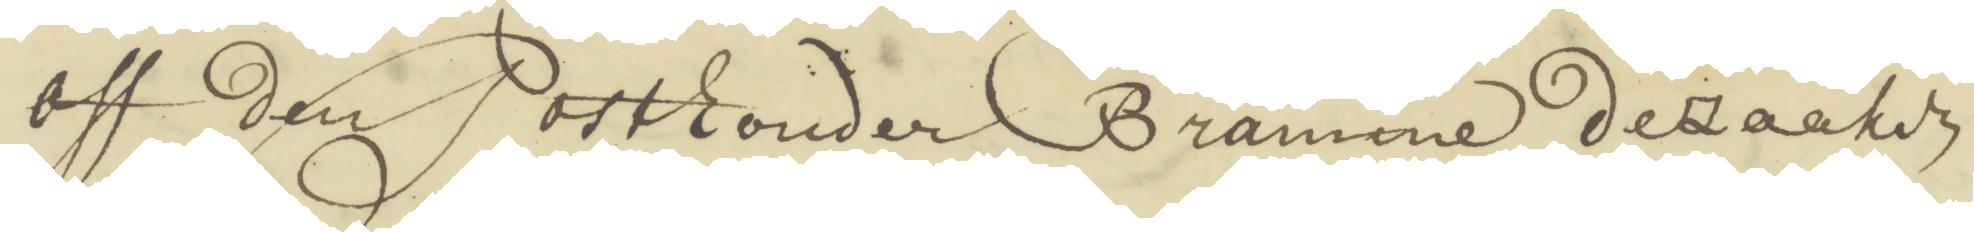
off den Posthouder Bramine de zaaken
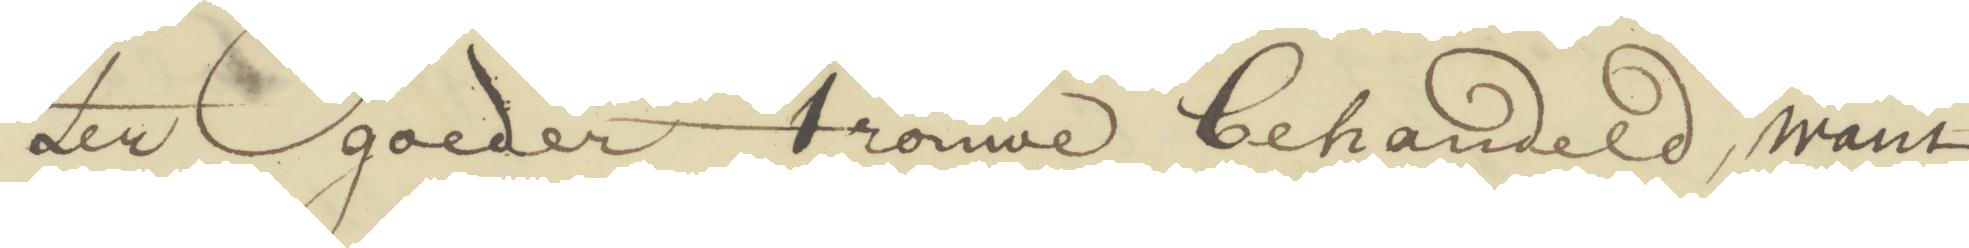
ter goeder trouwe behandeld, want
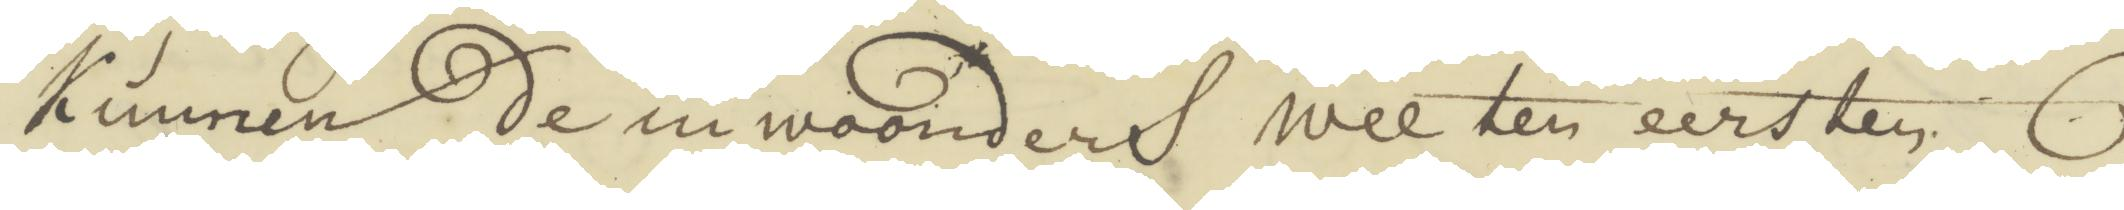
kunnen de in woonders wel ten eersten
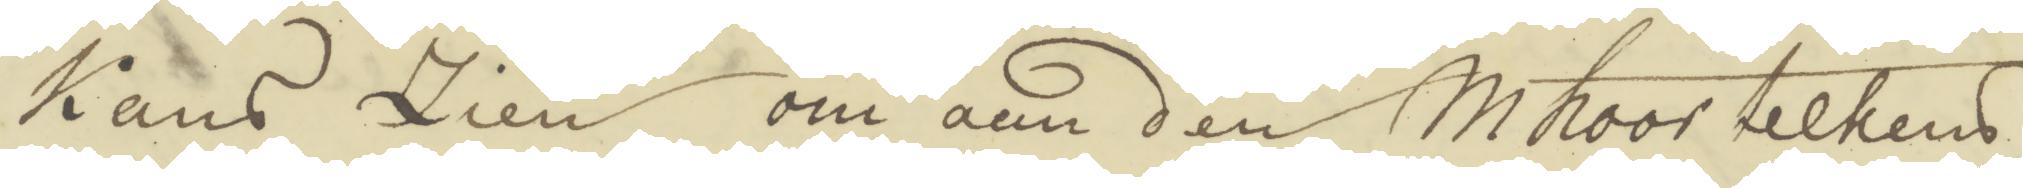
kans zien om aan den Mhoor telkens
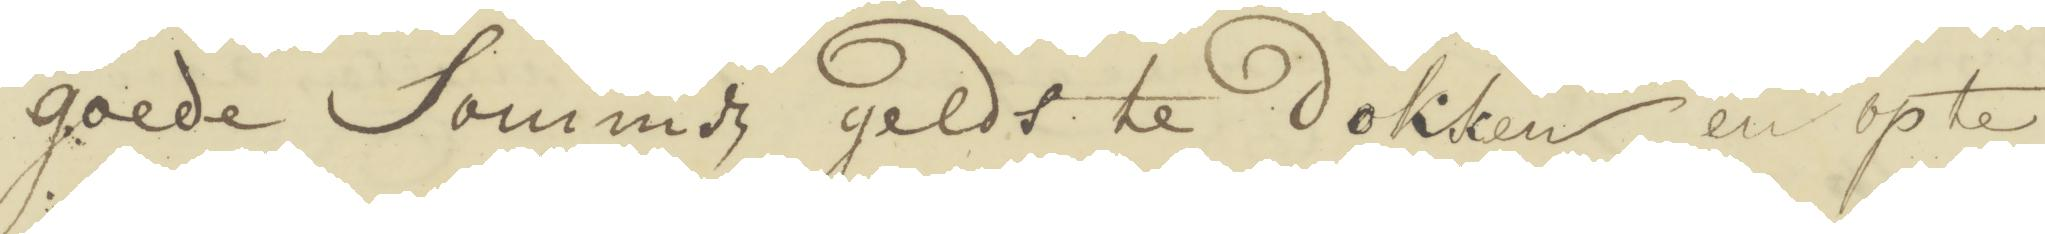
goede sommen gelds te dokken en op te
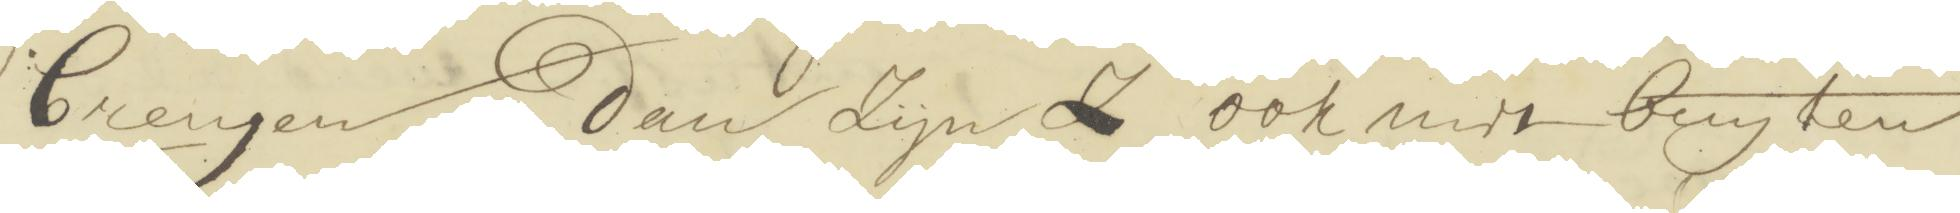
brengen, dan zijn z' ook niet buyten
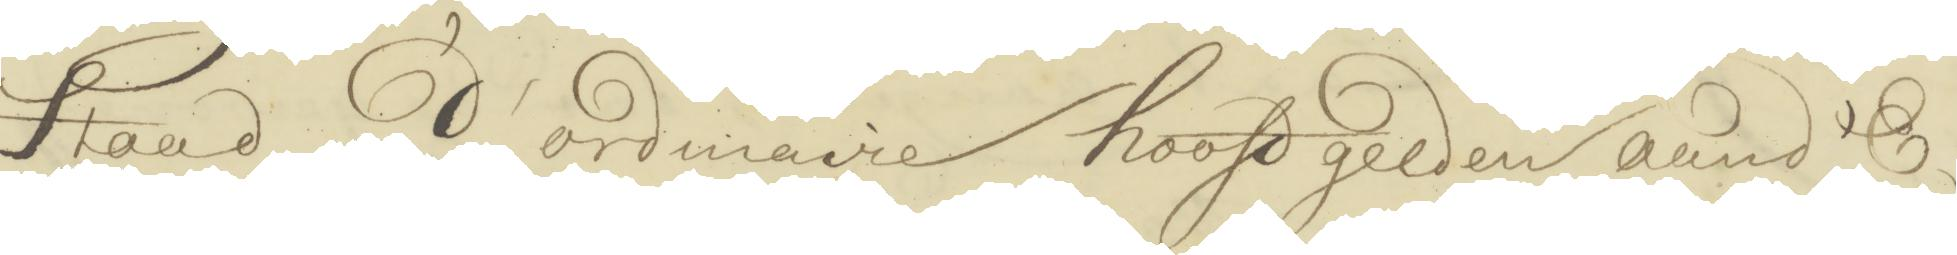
staad d' ordinaire hoofd gelden aand' E
